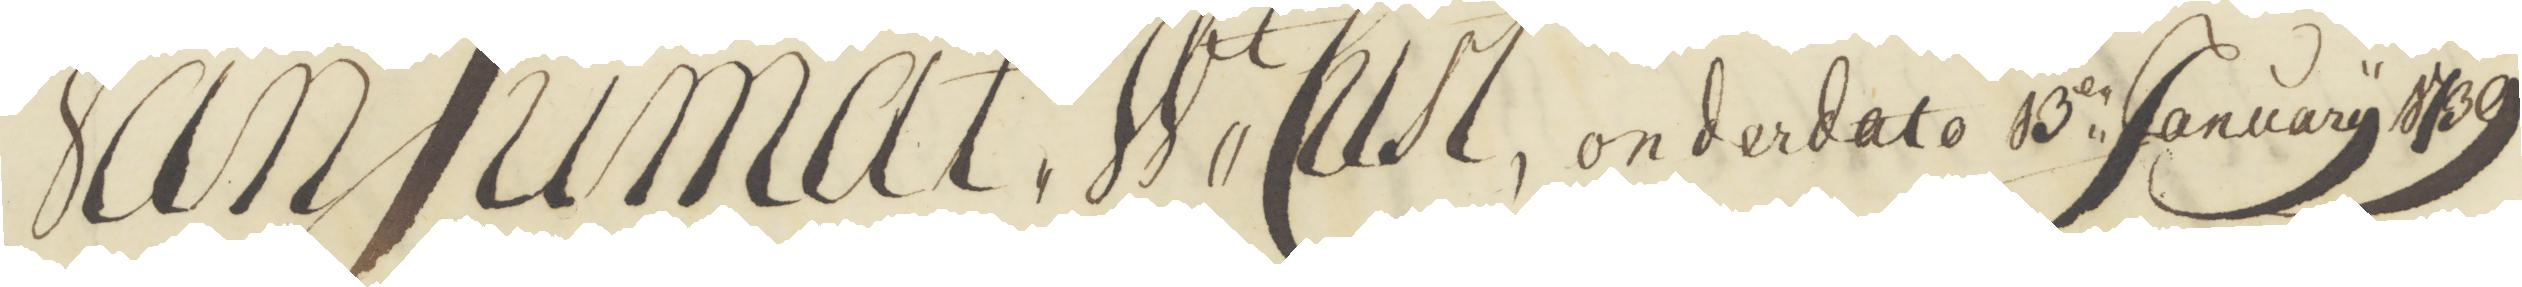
Van Sumat„s W„t Cust, onderdato 13„en Januarij 1739
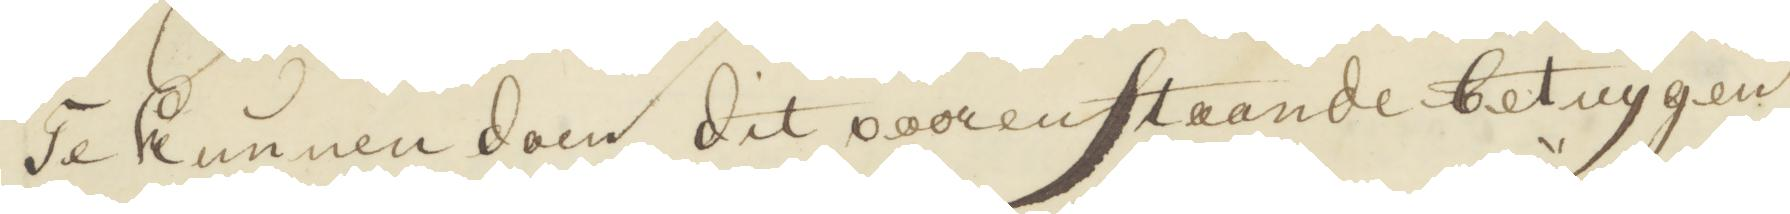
Te kunnen doen dit voorenstaande betuijgen
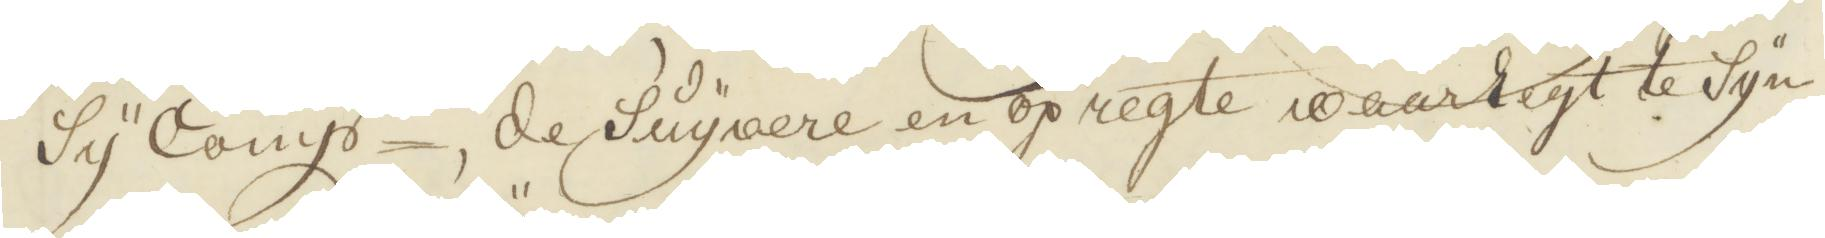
sij Comp=ten, de suivere en op regte waarheijt te sijn,
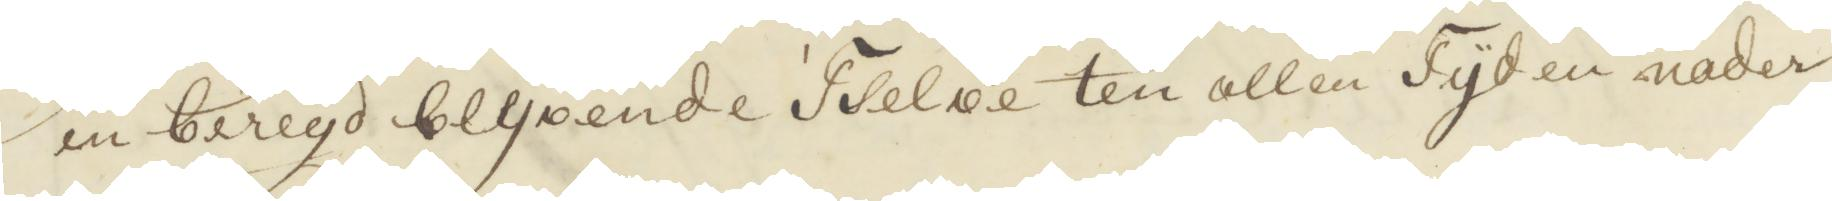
en bereijd blijvende 'Tselve ten allen Tijden nader
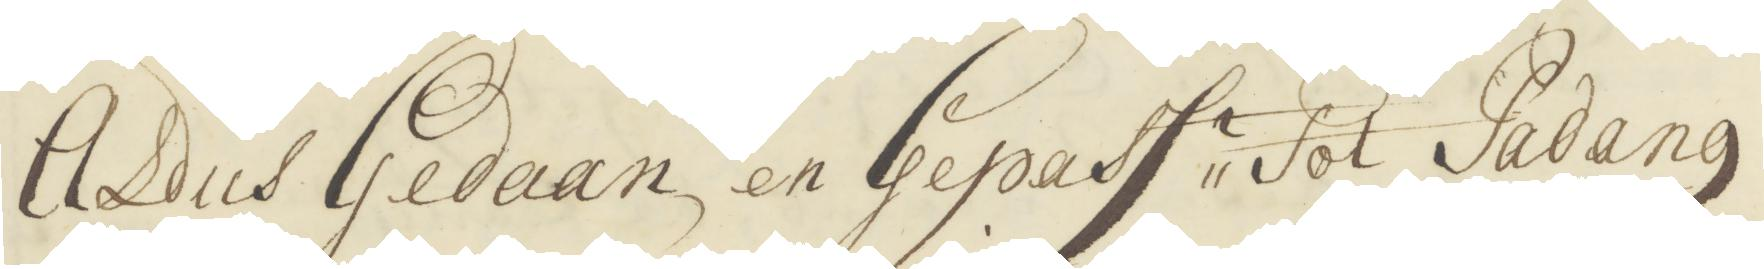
Aldus Gedaan en Gepass„t Tot Padang
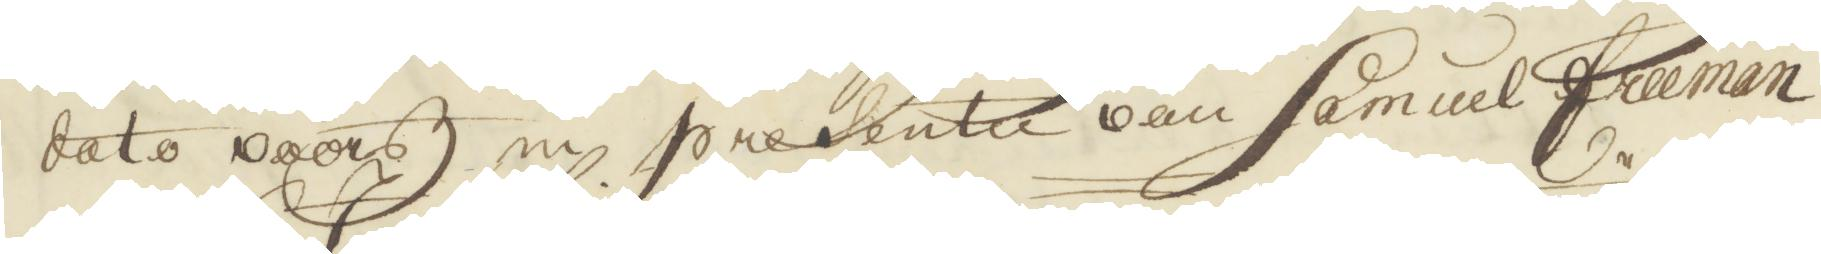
dato voorsz in presentie van Samuel Freeman
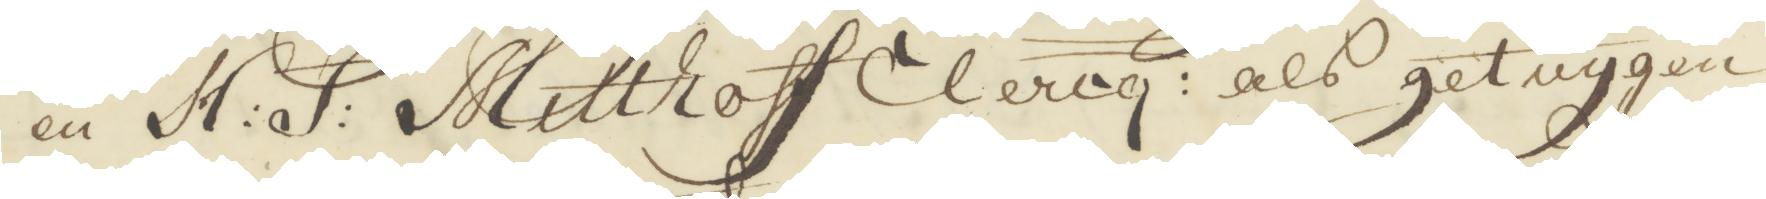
en H: J: Mitthoff Clercq: als getuijgen
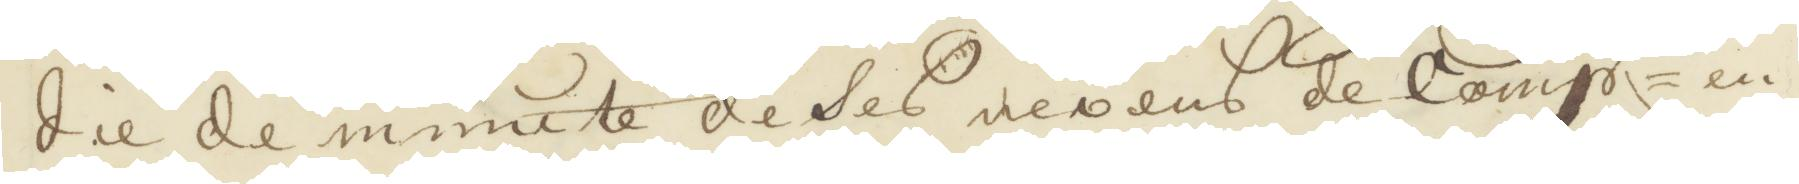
die de minute deses nevens de Comp=ten en
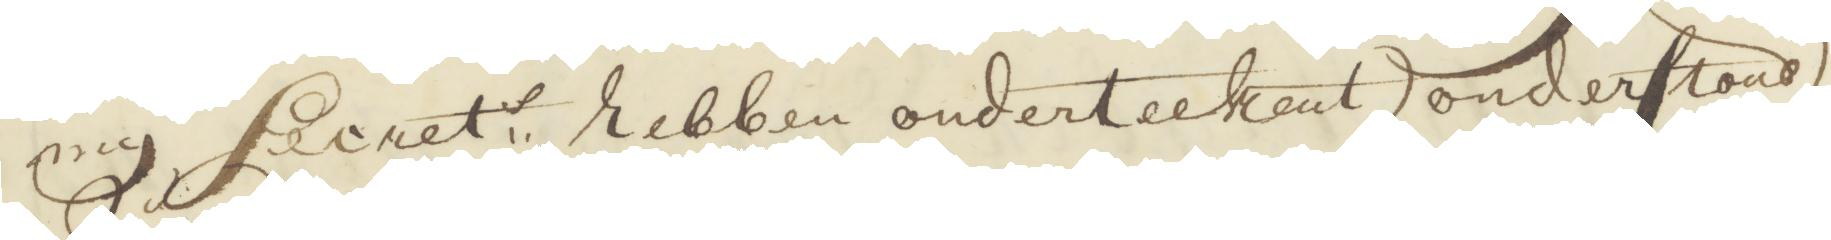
mij Secret„s hebben onderteekent ) onderstond )
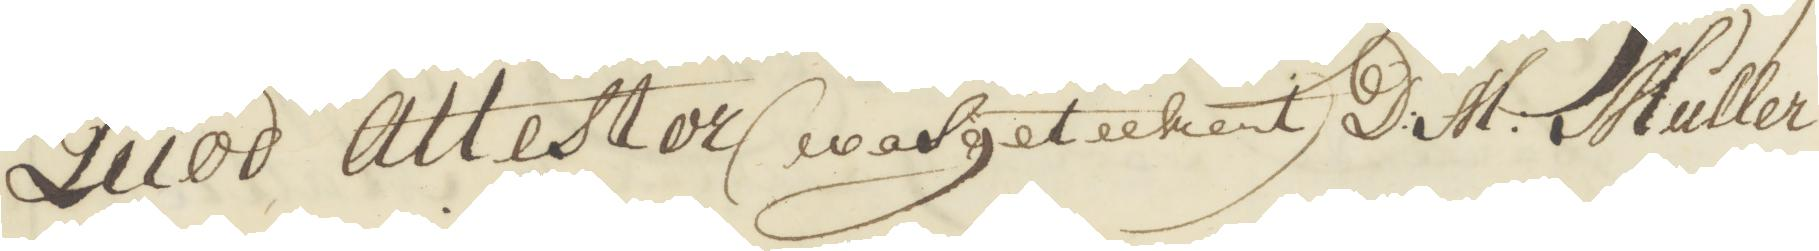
Quod attestor (was geteekent) D: M: Muller
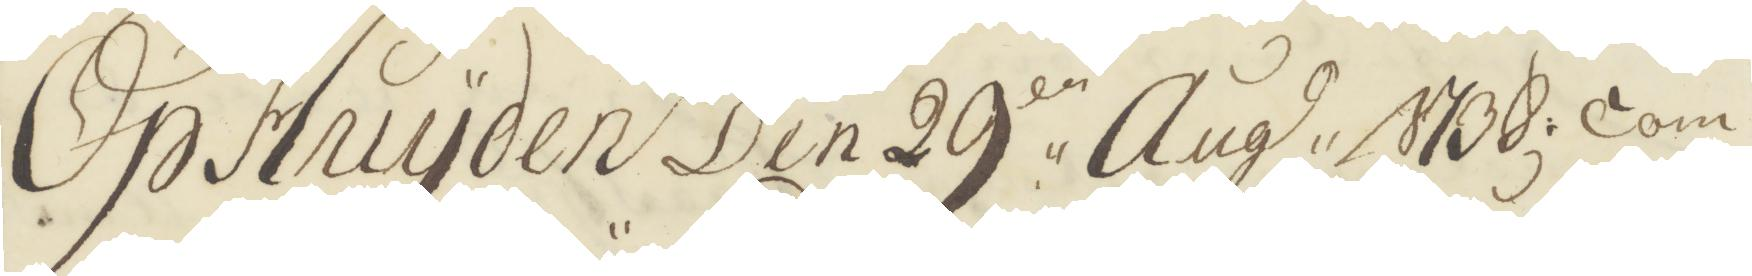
Op Huijden Den 29„en Aug„o 1738: Com
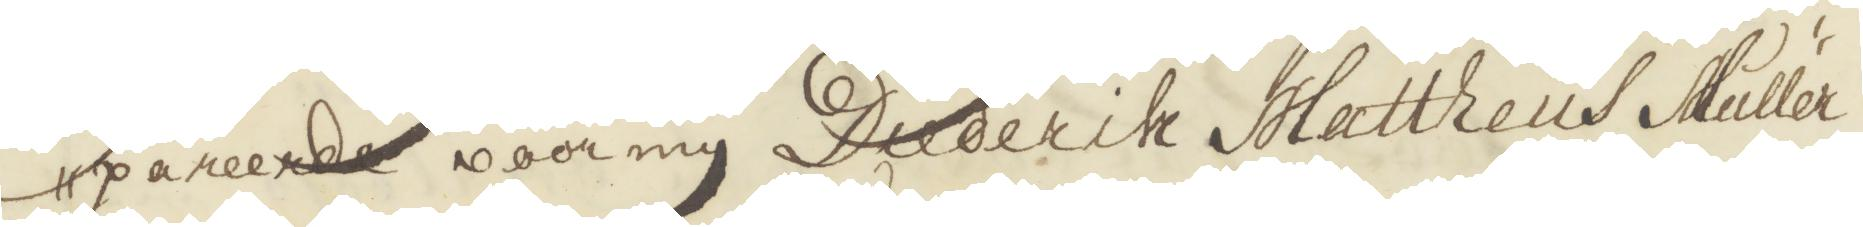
„pareerde voor mij Diederik Mattheus Muller
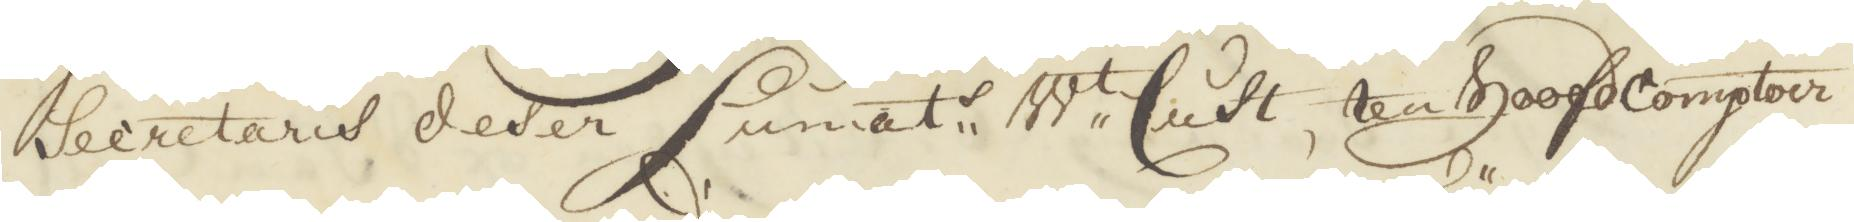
Secretaris deser Sumat„s W„t Cust, ten hoofdcomptoir
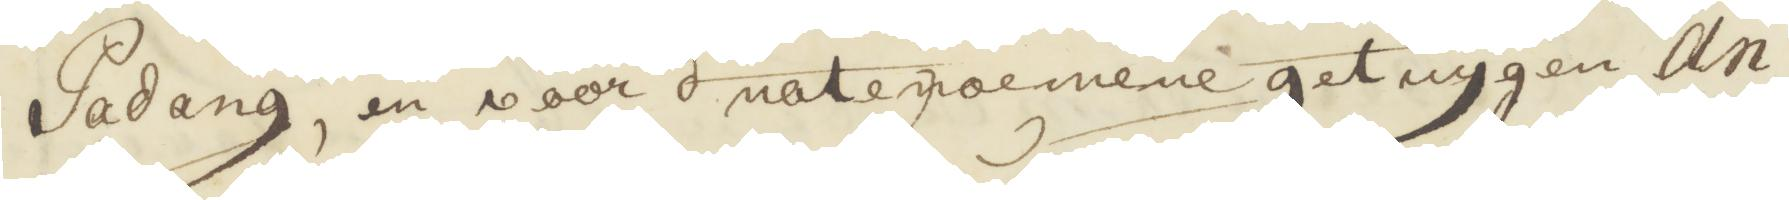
Padang, en voor d' natenoemene getuijgen, An
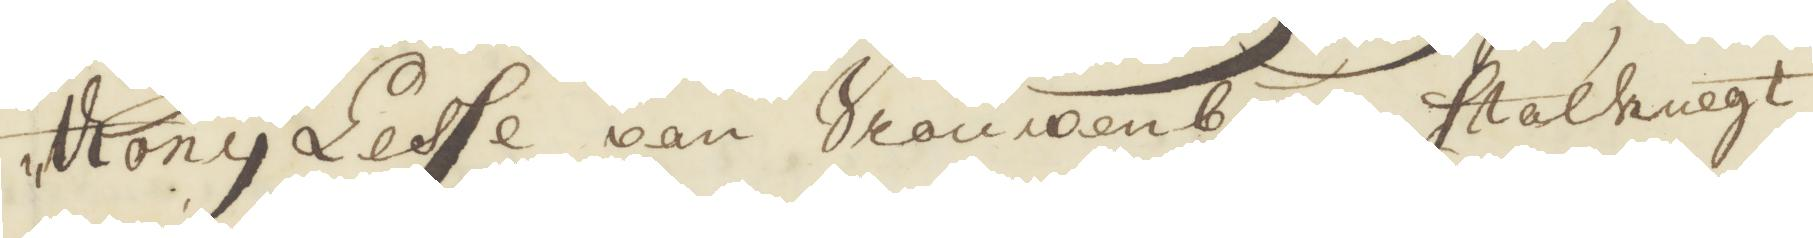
„thonij Hesse van Vrouwenburg stalknegt
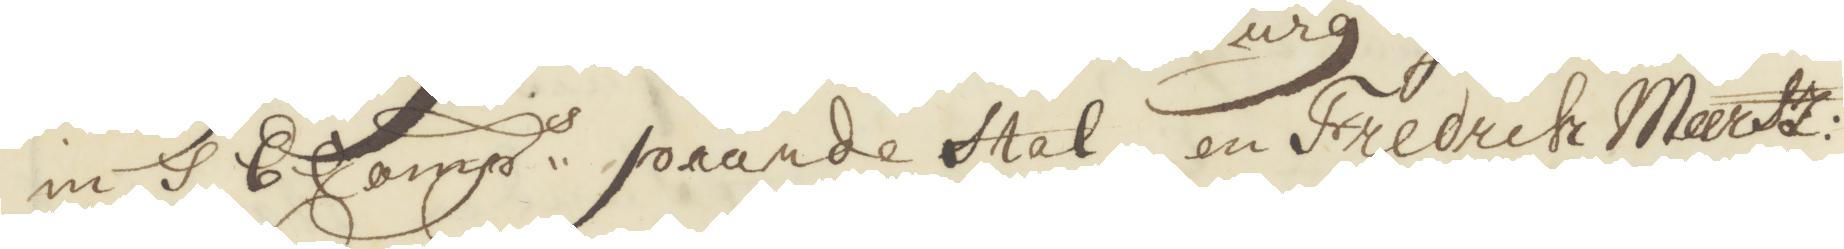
in ’s E: Comp„s paarde stal en Fredrik Meersz:
